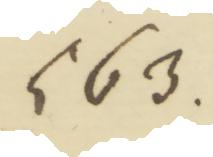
563.
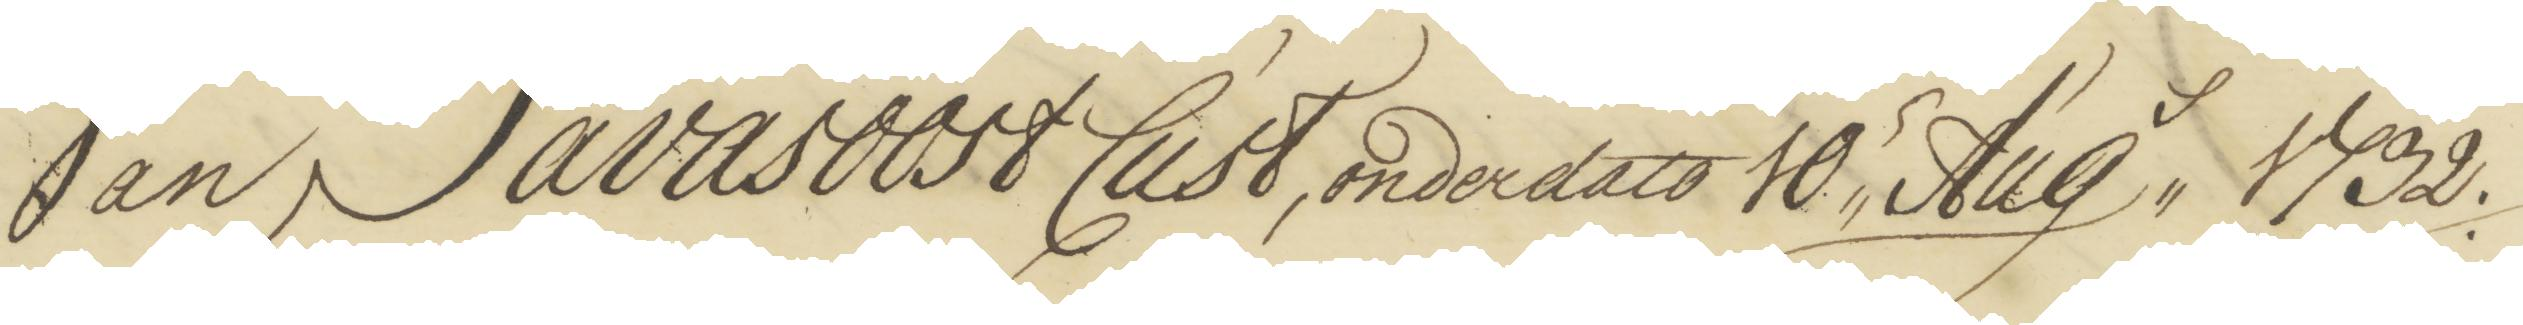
Van Iavasoost Cust, onderdato 10„' Aug„s 1732:
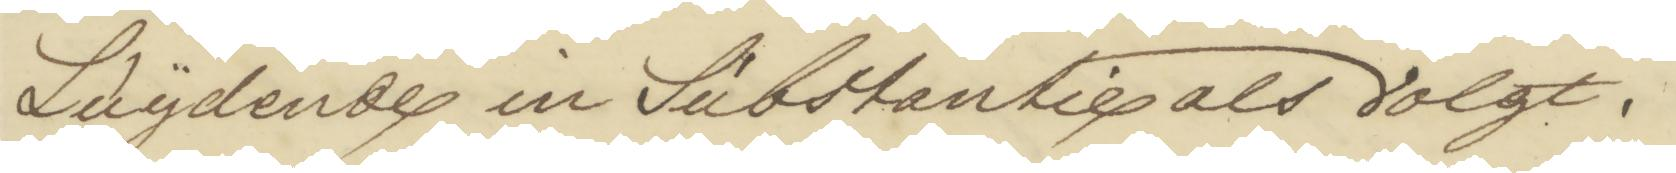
Luijdende in substantie als volgt.
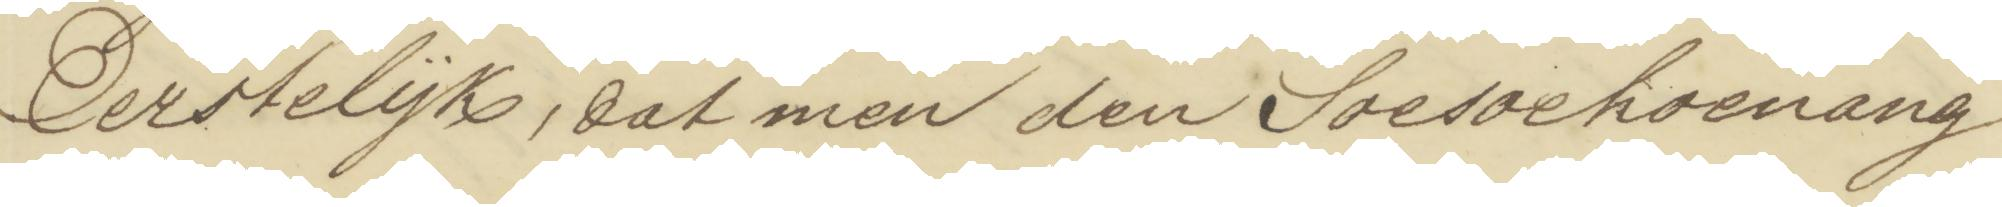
Eerstelijk, dat men den soesoehoenang
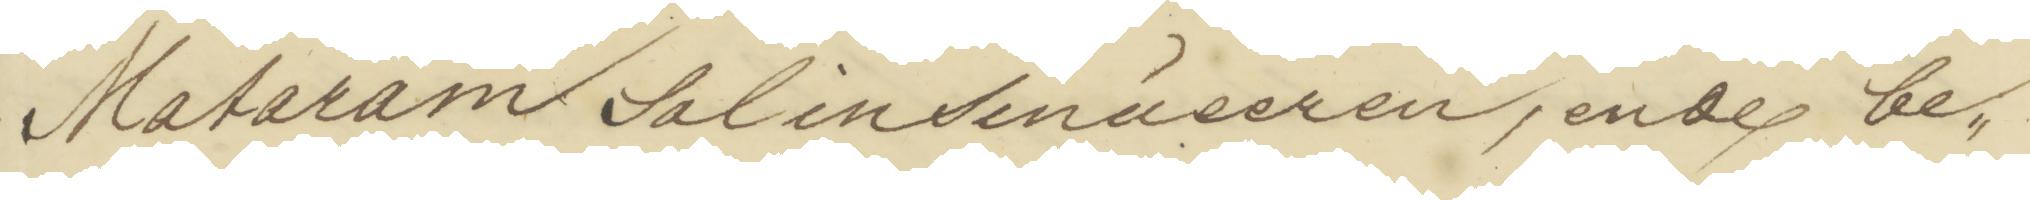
Mataram sal insinueeren, ende be„
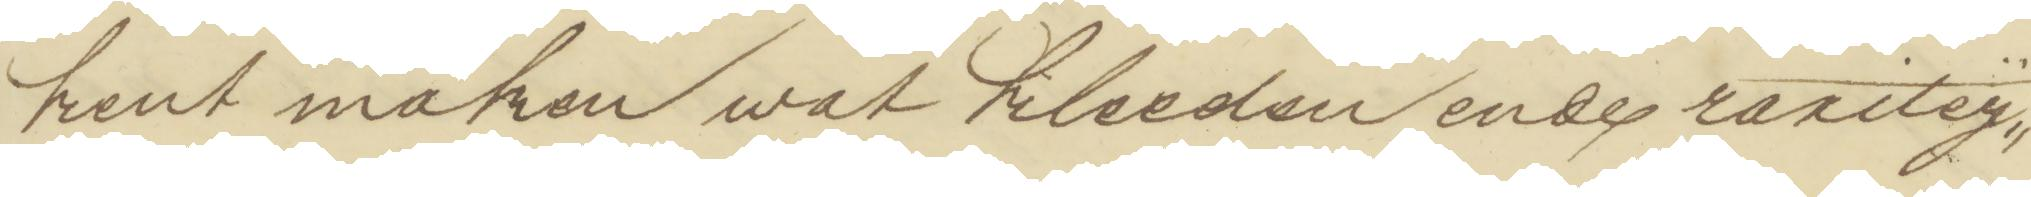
kent maken wat kleeden ende rariteij„
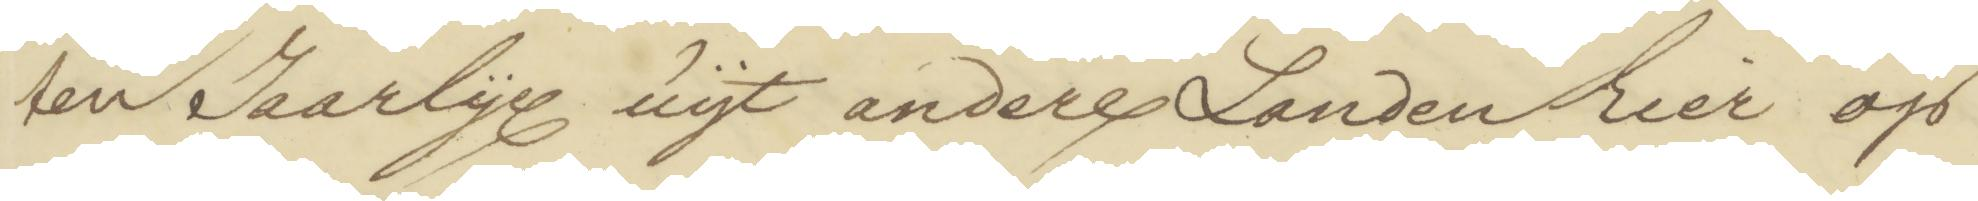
ten Iaarlijx uijt andere landen hier op
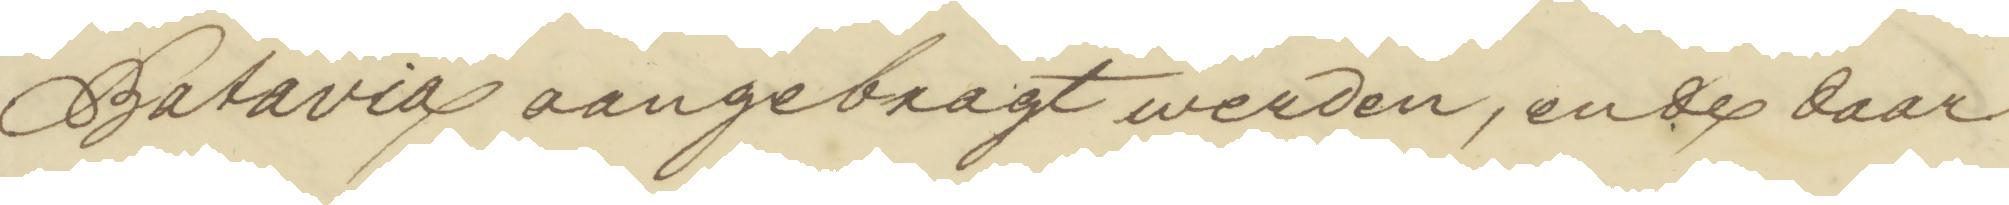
Batavia aangebragt werden, ende daar
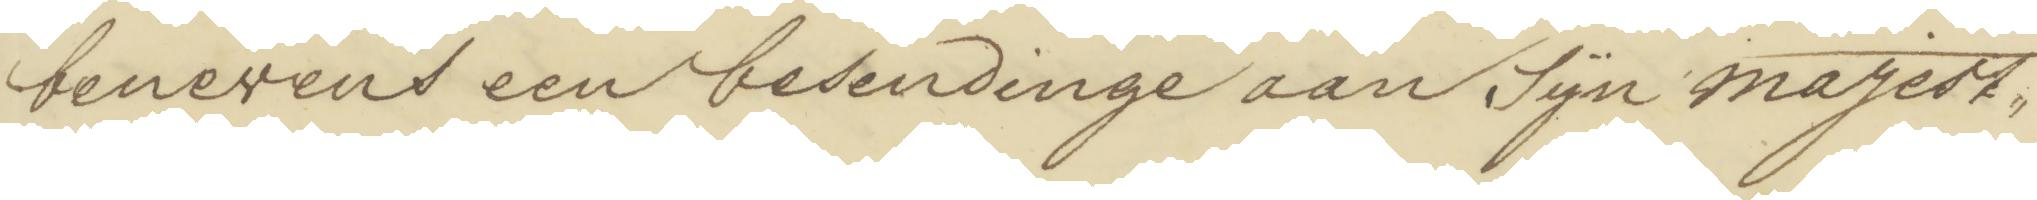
benevens een besendinge aan sijn majest„t
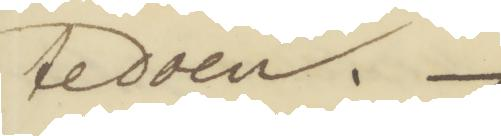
te doen. —
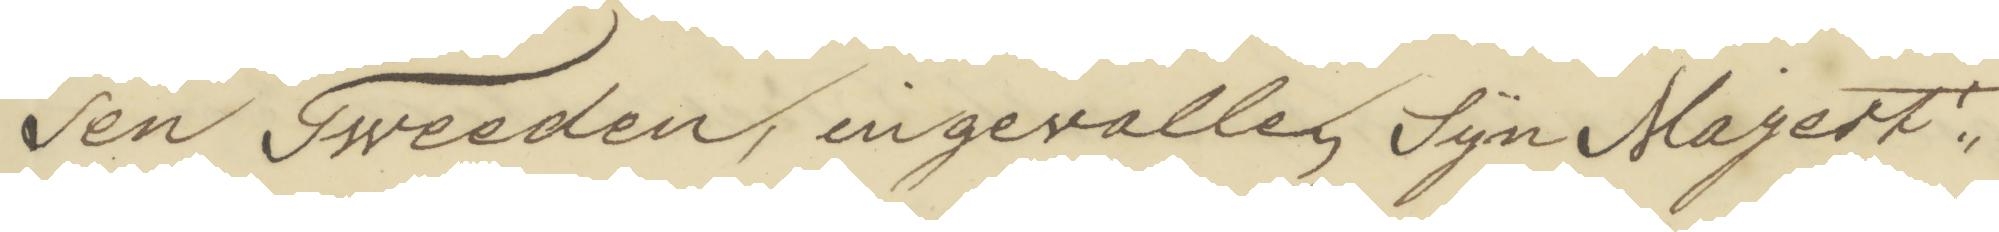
Ten Tweeden, ingevallen sijn Majest„t
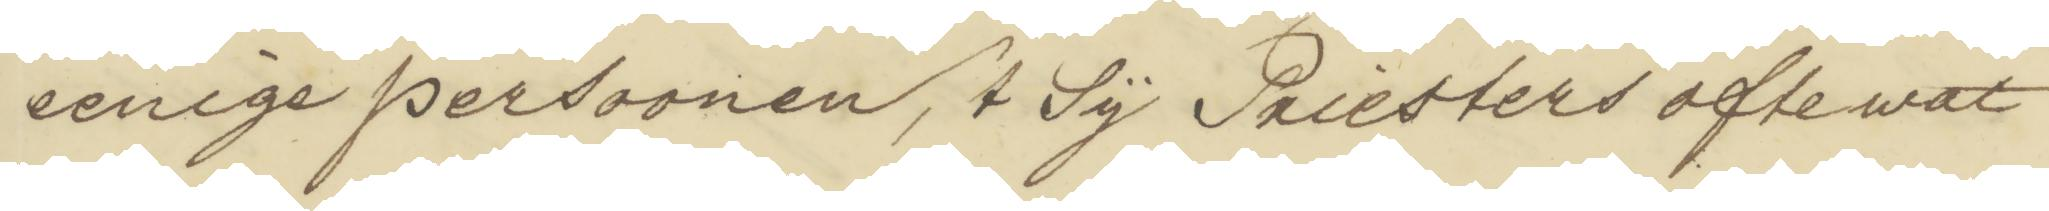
eenige persoonen, 't sij Priesters ofte wat
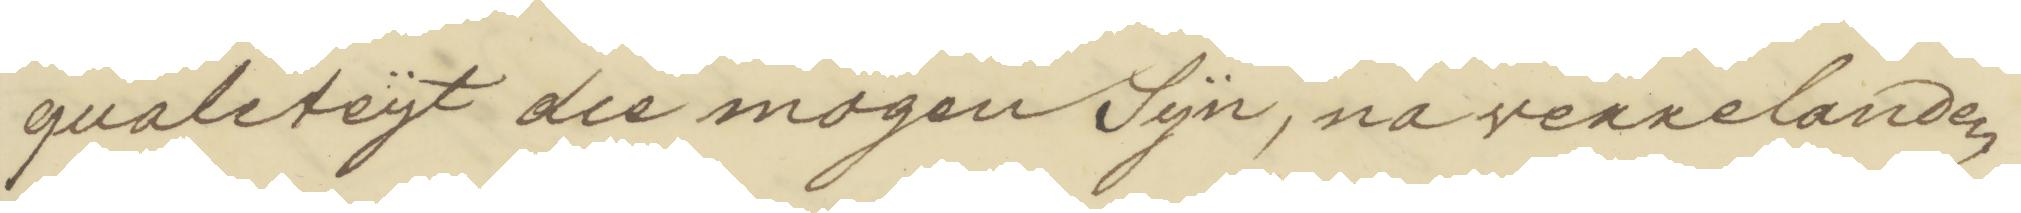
qualiteijt die mogen sijn, na verrelanden
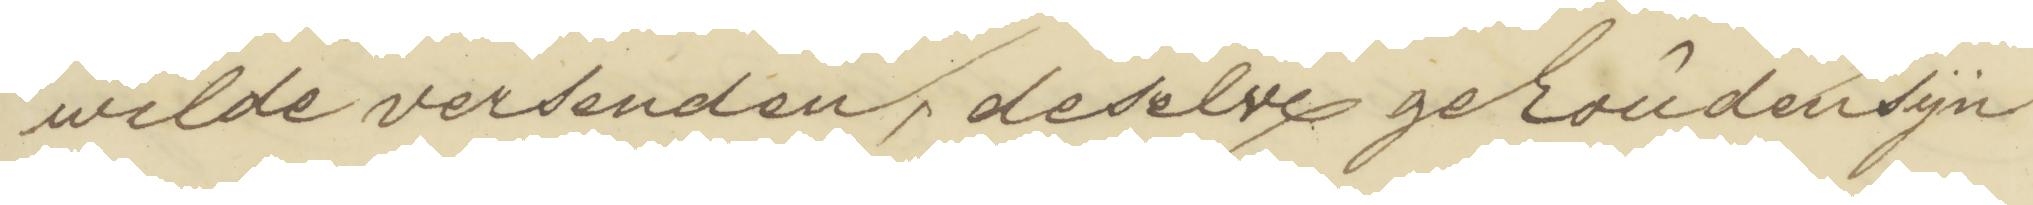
wilde versenden, deselve gehouden sijn
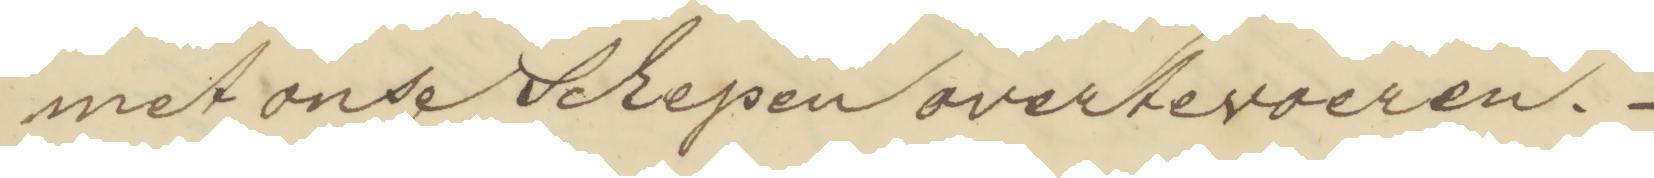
met onse schepen overtevoeren. -
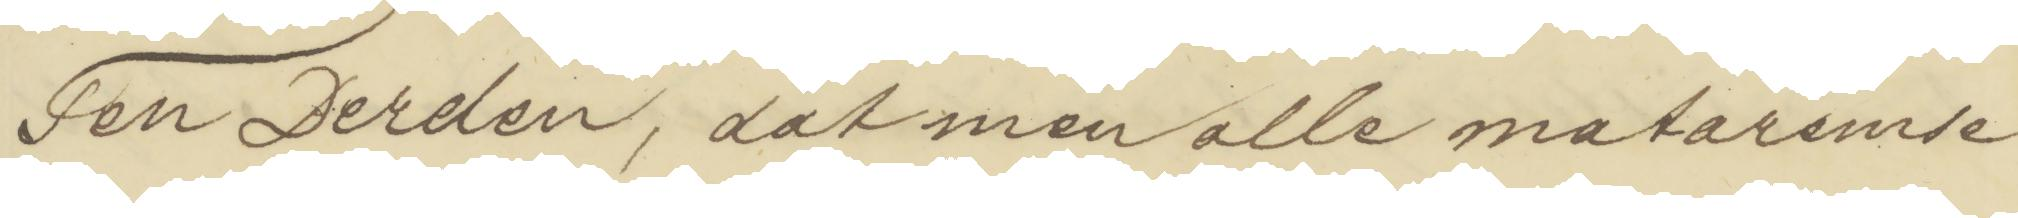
Ten Derden, dat men alle mataremse
